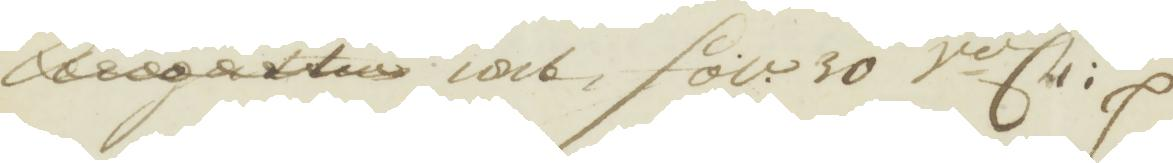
egatten 1816, fol.o 30 v=er C4:
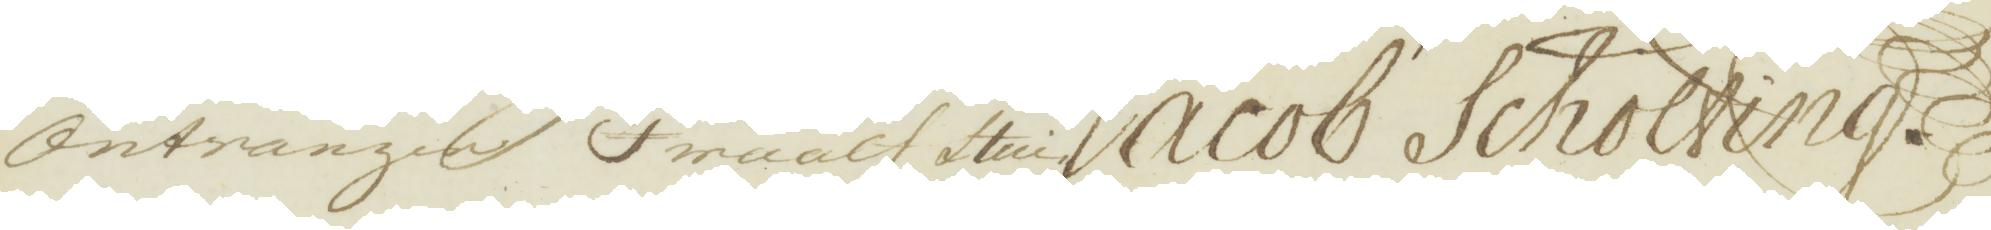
Ontvangen Twaalf stui„ Jacob Scholting
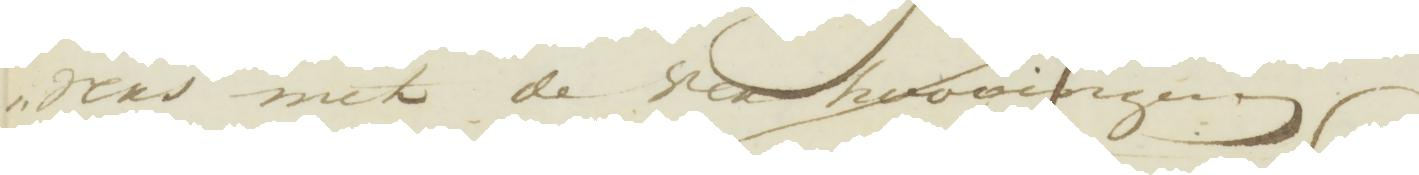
„vers met de verkoopingen
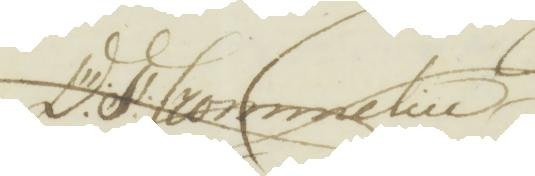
D:I:Crommelin
